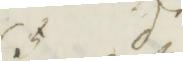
5 d„o
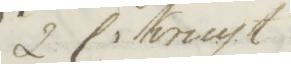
2 C. kruyt
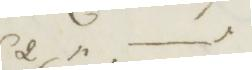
2 „ _o
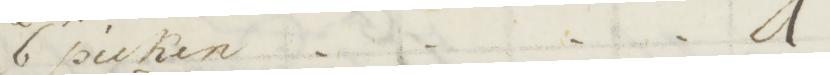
6 pieken - - - - 4
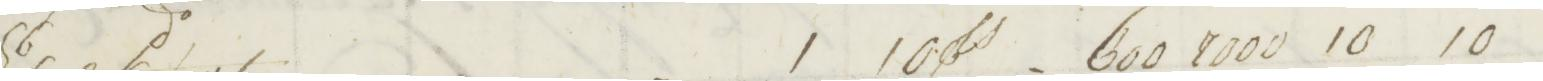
6 d,o 1 10ps - 600 7000 10 10
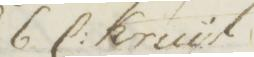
6 C: kruijt
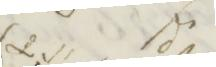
2 d,o
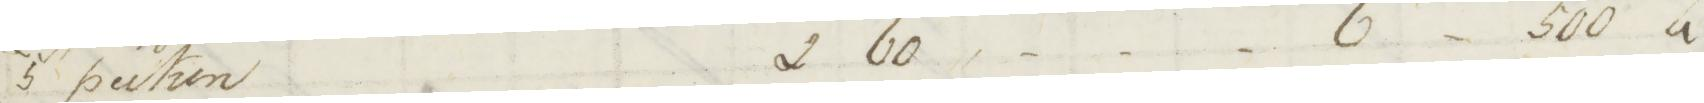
5 pieken 2 60 , - - - 6 - 500 4
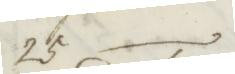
25 _o
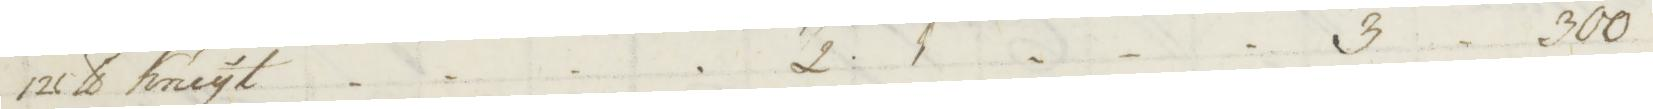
125 lb kruijt - - - - ½: 1 - - - 3 - 300
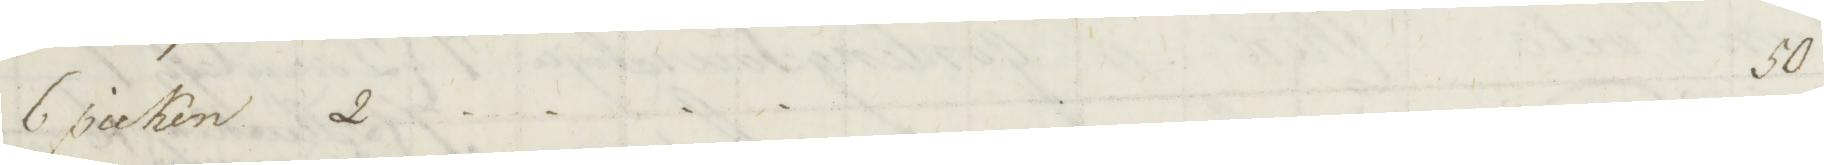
6 pieken 2 - - - - 50
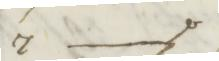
7 _o
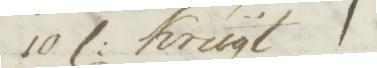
10 C: kruijt 1
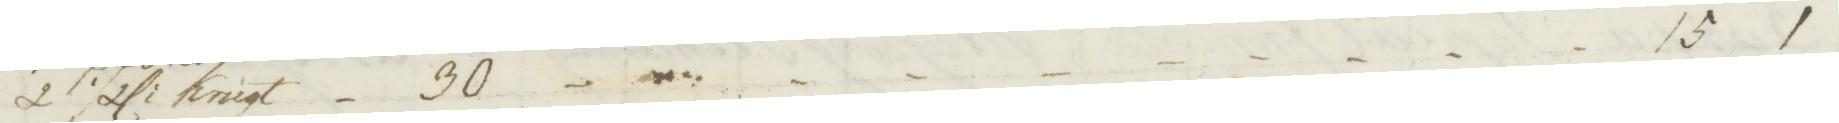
2 ½ C: kruijt - 30 - - - - - - - - - - 15 1
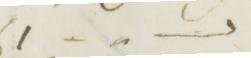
1 - „ _o
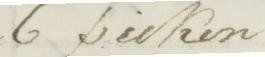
6 pieken
